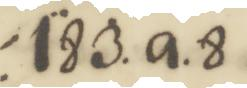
- 183. 4.8
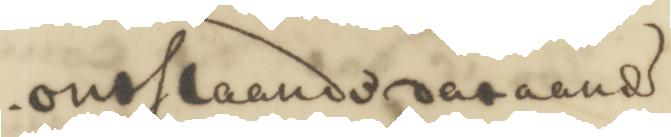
- ontstaande dat aande
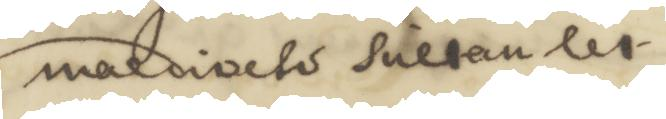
maldivels sultan het
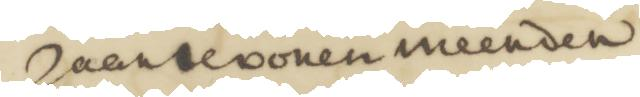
Jaartevoren meerder
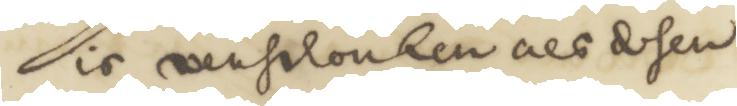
is verschonken als desen
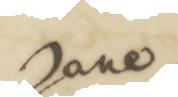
Jare
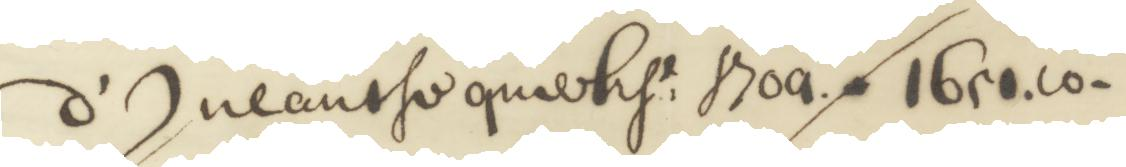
d’ Jnlantse queeks:' 1704. ƒ 1651.10-
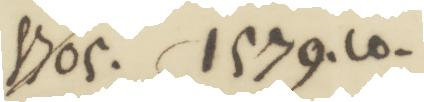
1705. 1579.10-
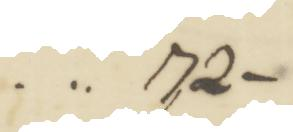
- - - 72—
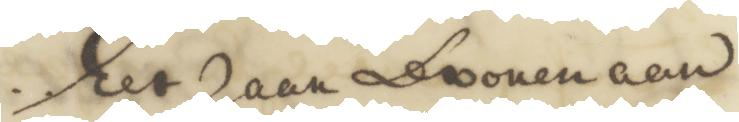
- - het Jaar tevoren aan
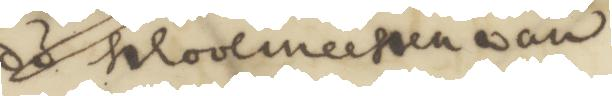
de schoolmeester van
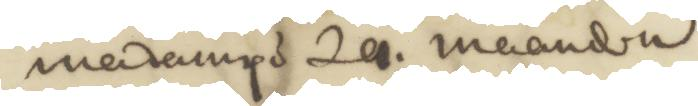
madampe 24. maanden
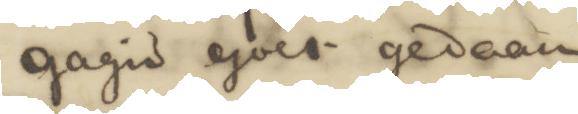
gagie goet gedaan
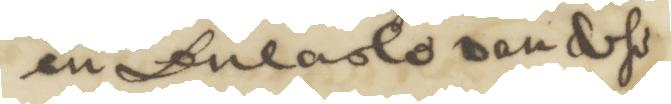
en tenlaste van dese
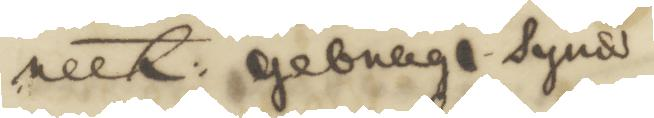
reek: gebragt sijnde
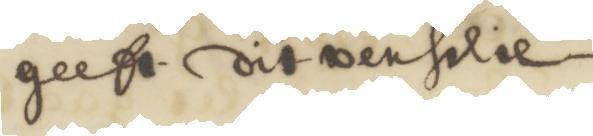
geeft dit verschil
